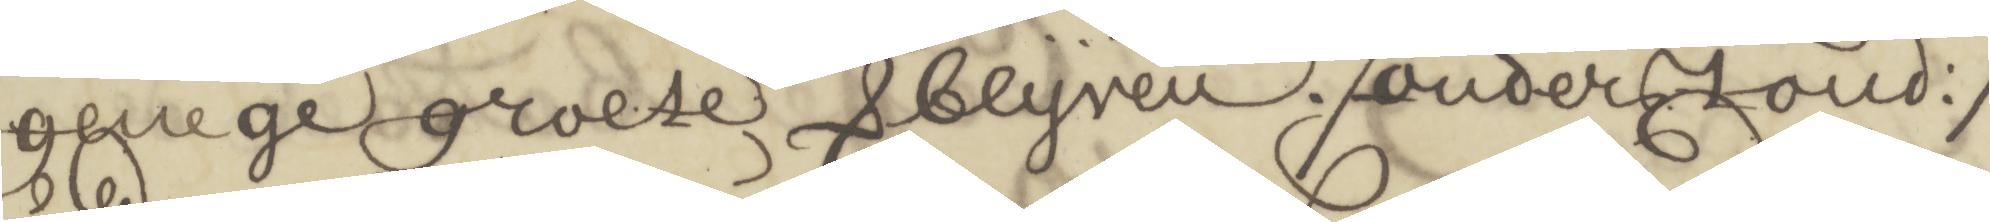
genege groete, verblijven. /onderstond:/
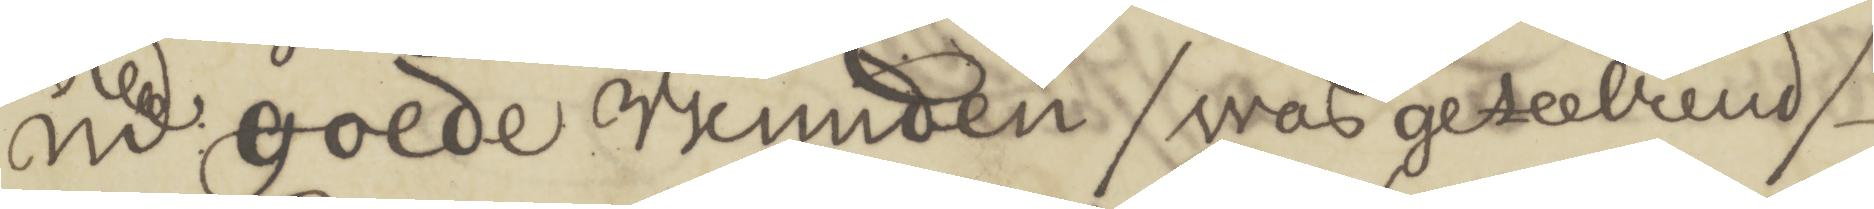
uE: goede vrunden /was geteekend/
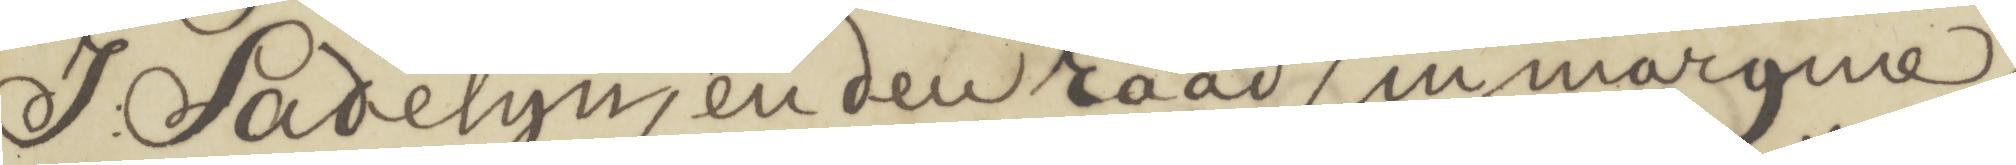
I: Sadelijn, en den raad / in margine /
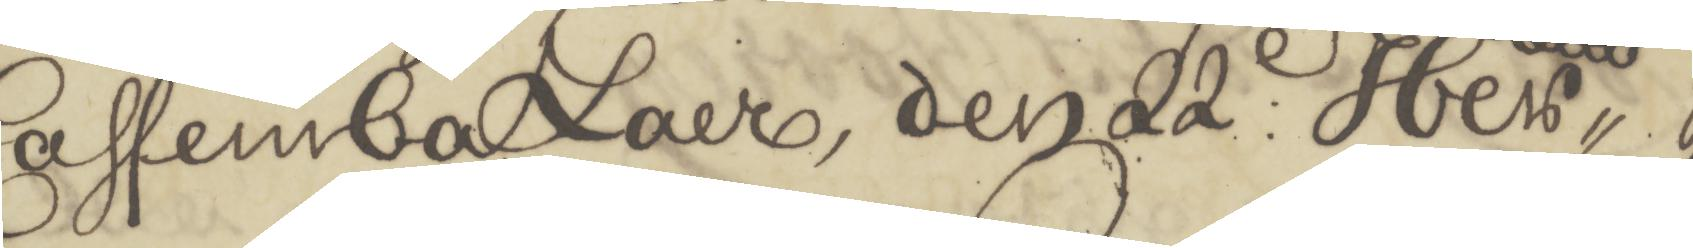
Cassembazaer, den 22:e 7ber„ 1725:
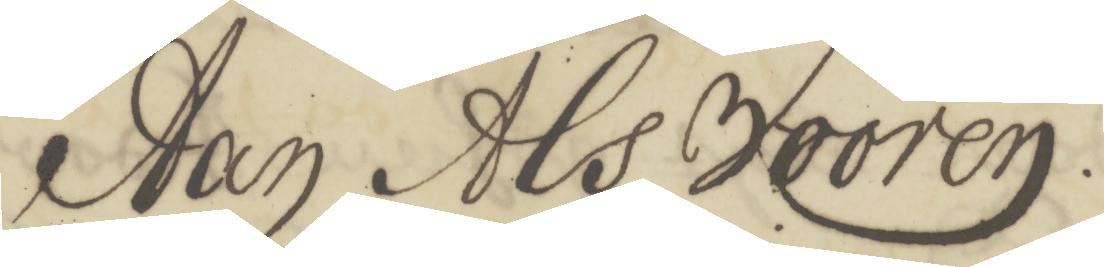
Aan Als Vooren.
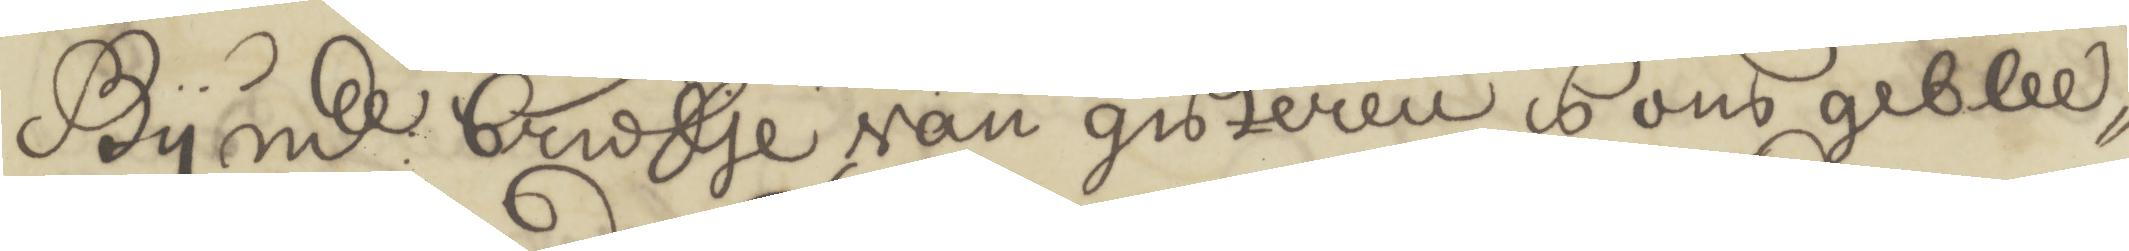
Bij uE: briefje van gisteren is ons geblee„
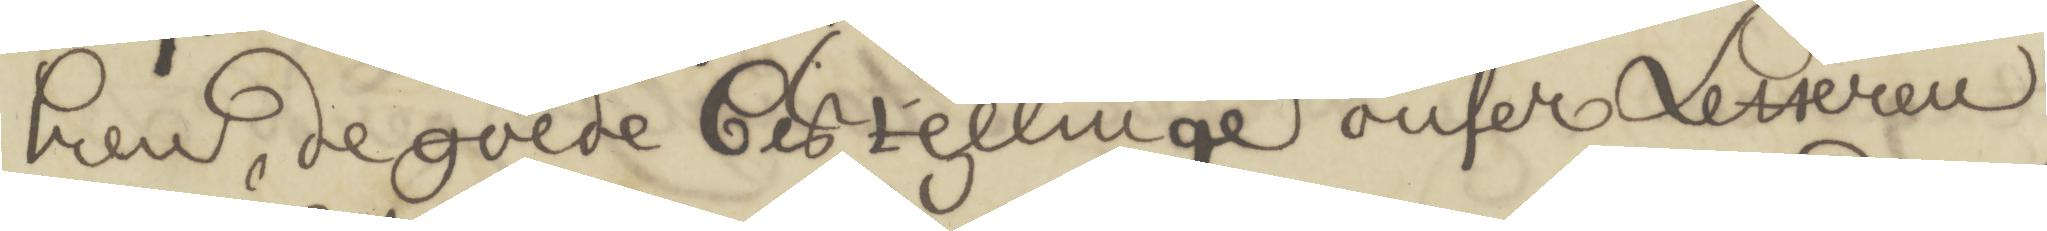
ken, de goede bestellinge onser Letteren
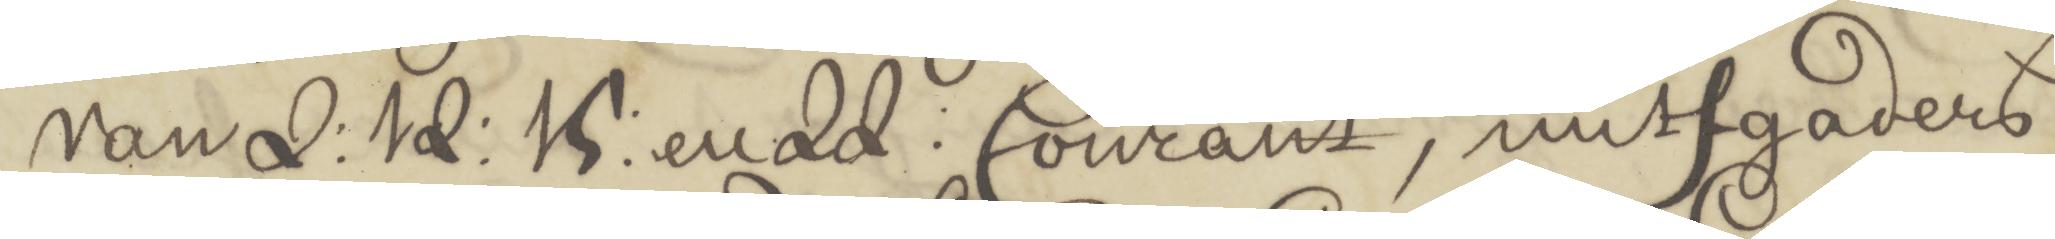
van 2: 12: 15: en 22: Courant, mitsgaders
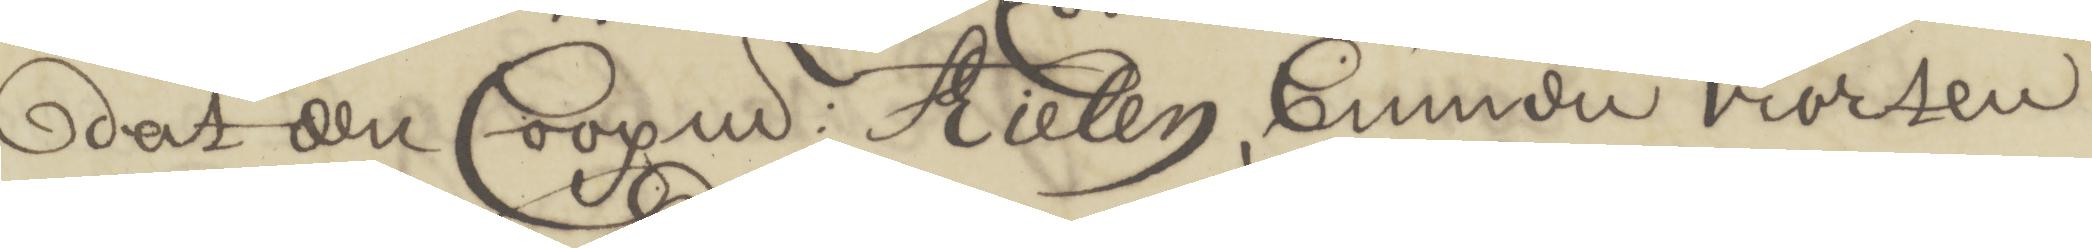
dat den Coopm: Kielen, binnen korten
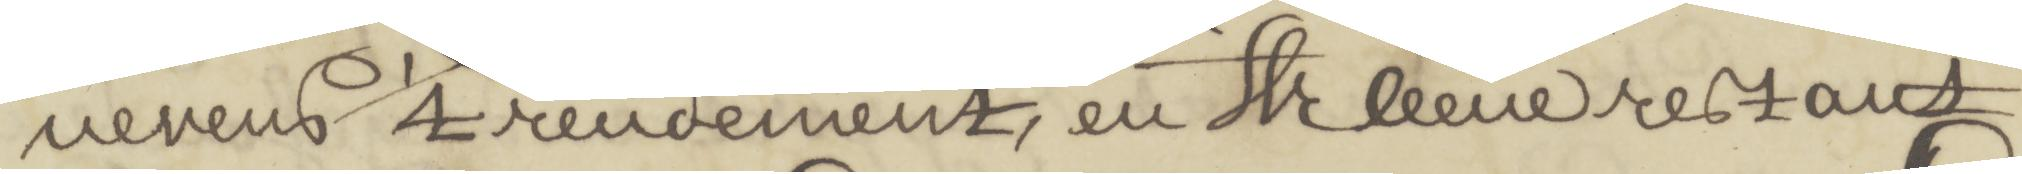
nevens 't rendement, en 'tkleene restant
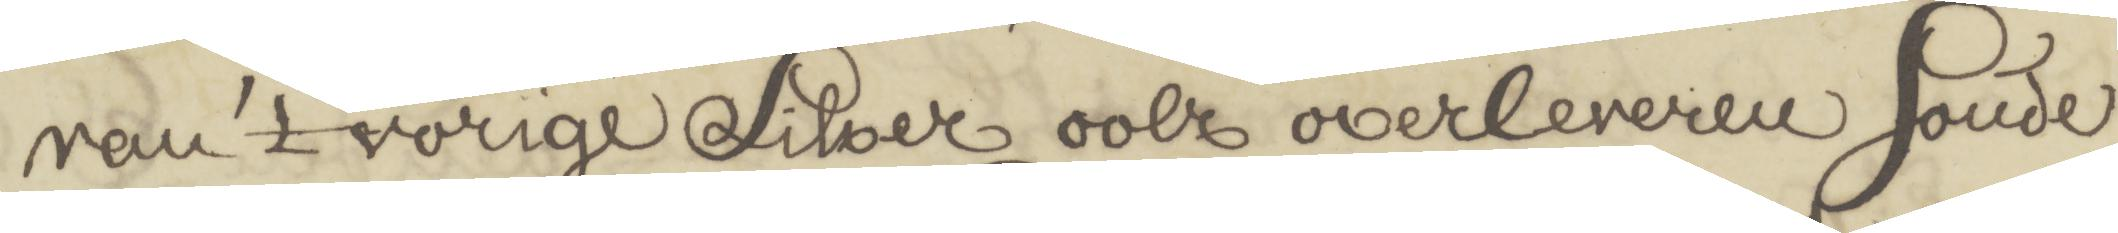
van ’t vorige silver ook overleveren soude,
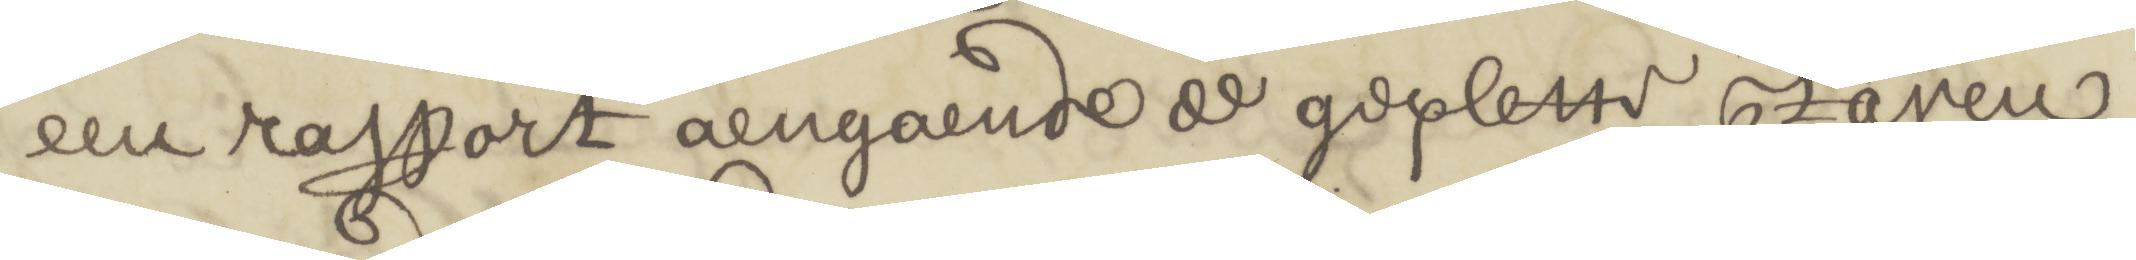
een rapport aengaende de geplette staven
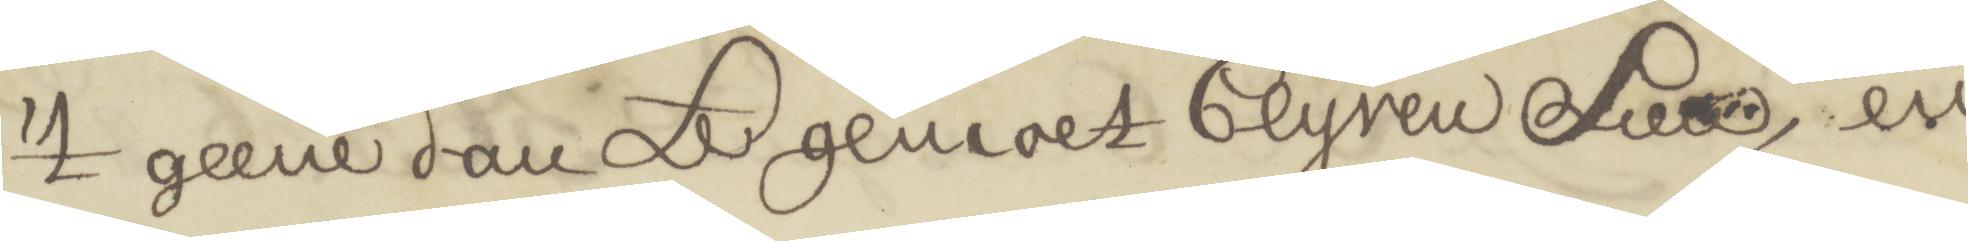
’t geene dan te gemoet blijven sien, en
